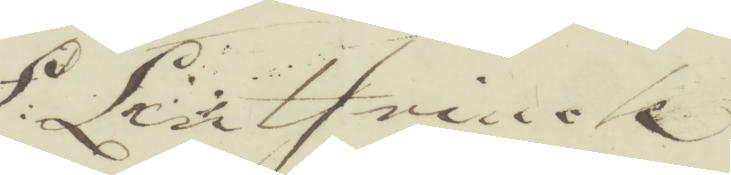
L: Lentfrinck
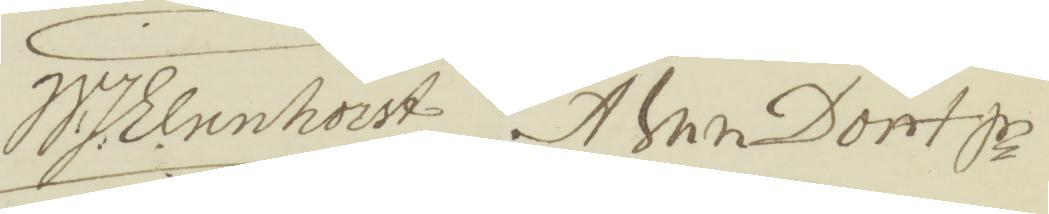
W:J:Elsenhorst A Van Dort j=r
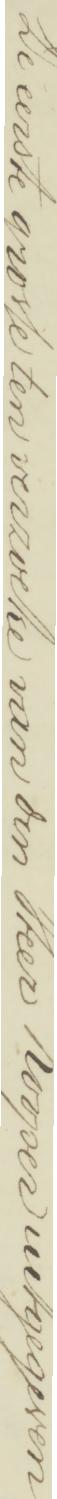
De eerste grosse ten verzoeke van den Heer Kooper uitgegeven
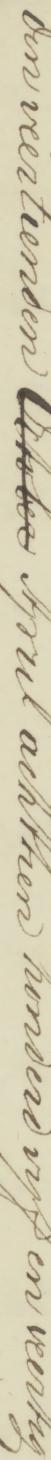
den veertienden October April achttien honderd vyf en veertig
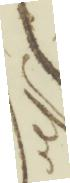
DFCr
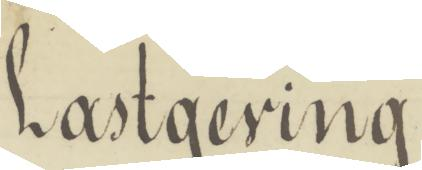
Lastgeving
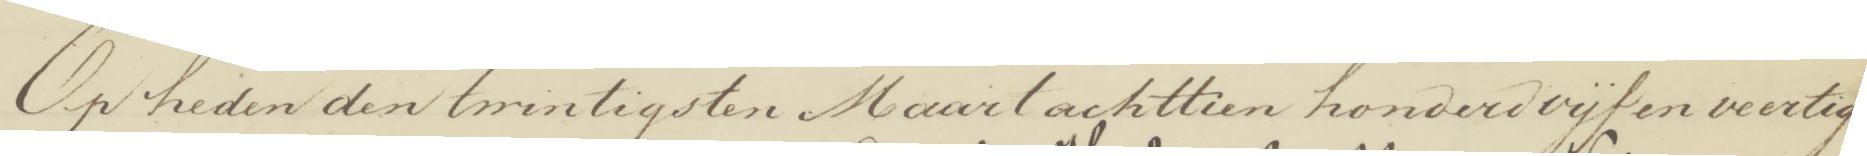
Op heden den twintigsten Maart achttien honderd vijf en veertig
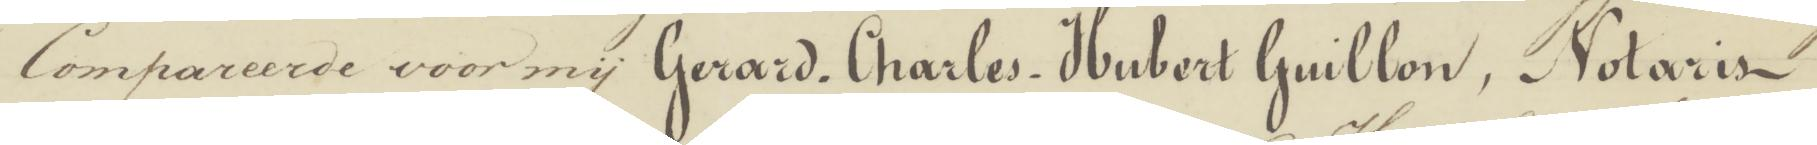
Compareerde voor mij Gerard. Charles- Hubert Guillon, Notaris
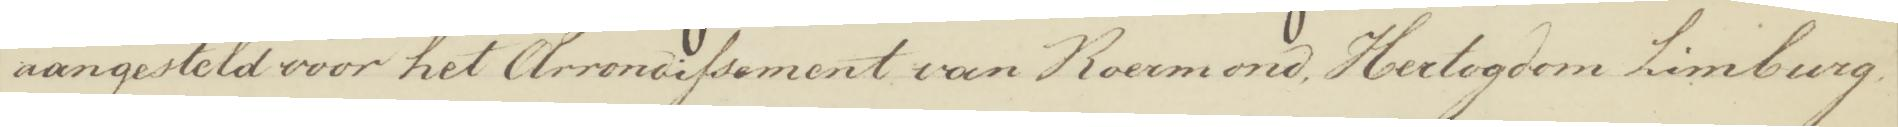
aangesteld voor het Arrondissement van Roermond, Hertogdom Limburg,
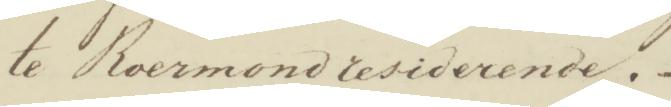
te Roermond residerende.
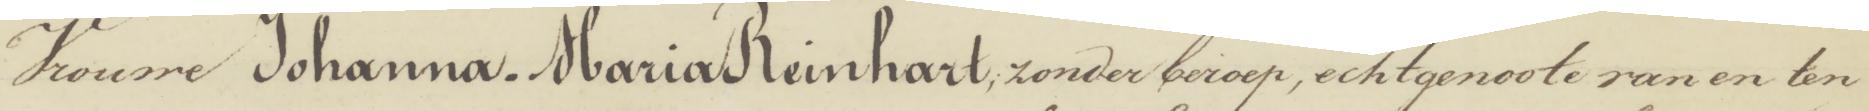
Vrouwe Johanna Maria Reinhart, zonder beroep, echtgenoote van en ten
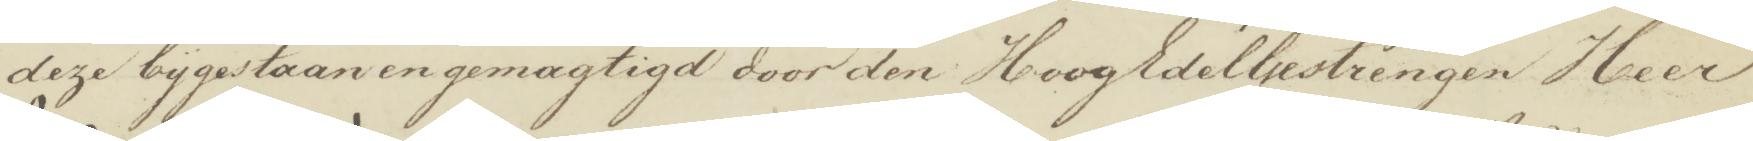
deze bij gestaan en gemagtigd door den Hoog EdelGestrengen Heer
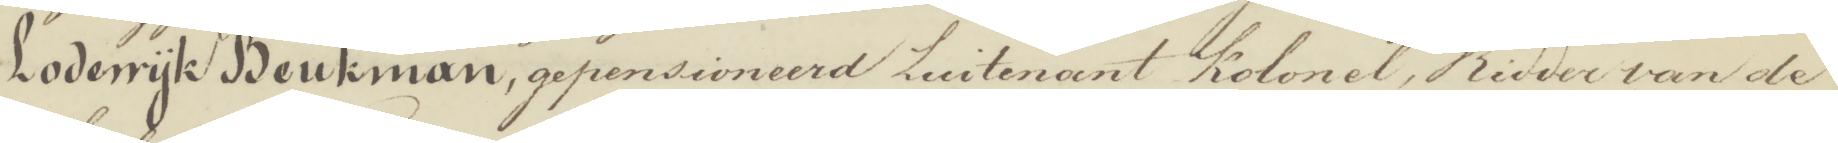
Lodewijk Beukman, gepensioneerd Luitenant Kolonel, Ridder van de
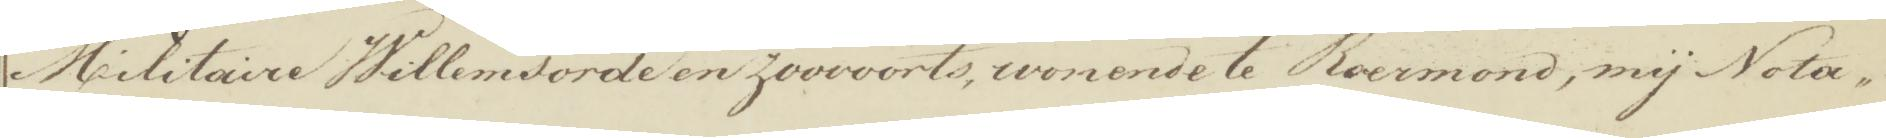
Militaire Willemsorde en zoovoorts, wonende te Roermond, mij Nota„
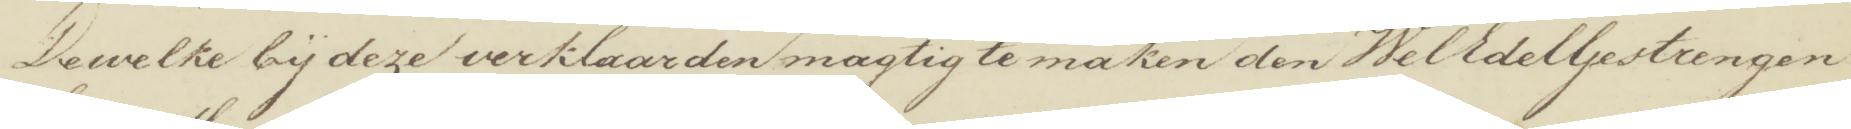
Dewelke bij deze verklaarden magtig te maken den Wel Edel Gestrengen
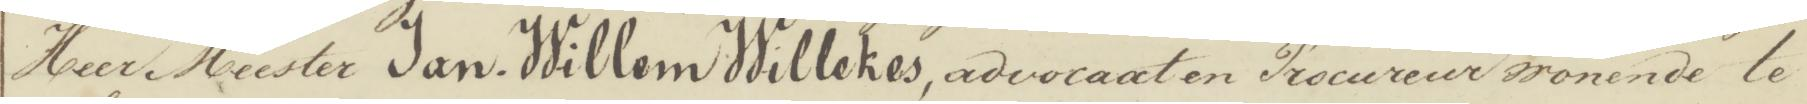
Heer Meester Jan-Willem Willekes, advocaaten Procureur wonende te
